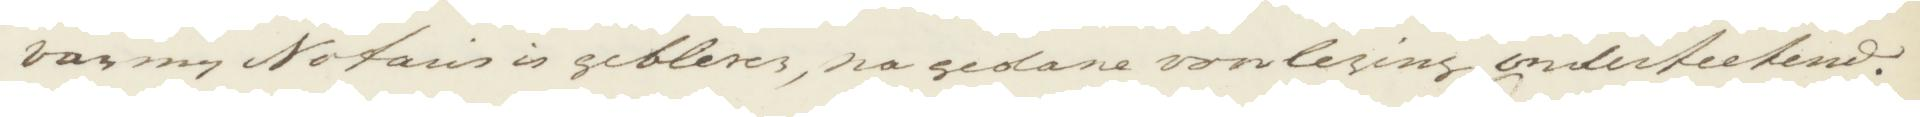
van my Notaris is gebleven, na gedane voorlezing, onderteekend.
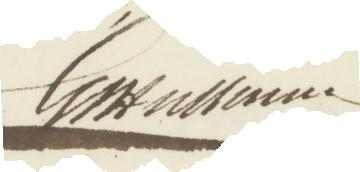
Gvanmussang
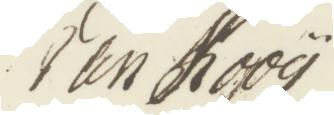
Van Hooij
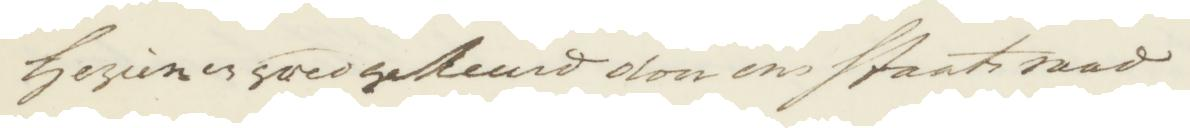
Gezien en goedgekeurd door ons staats raad
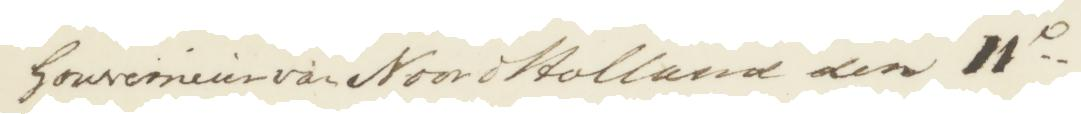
Gouverneur van Noord Holland den 11.e.
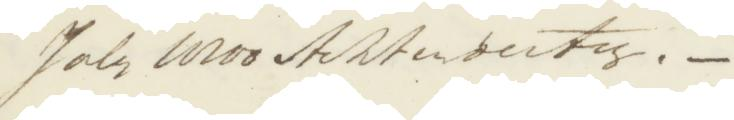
July 1800 Achtendertig. —
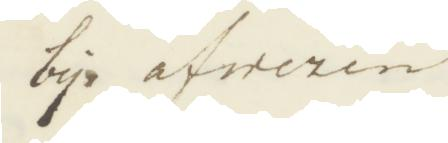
bij afwezen
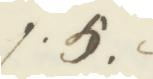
. 5.
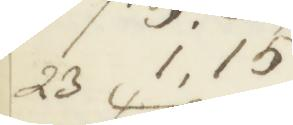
23 1,15
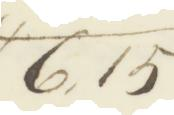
6,15
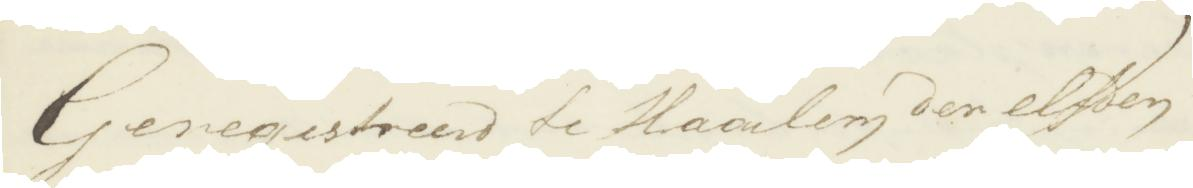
Geregistreerd te Haarlem den elfden
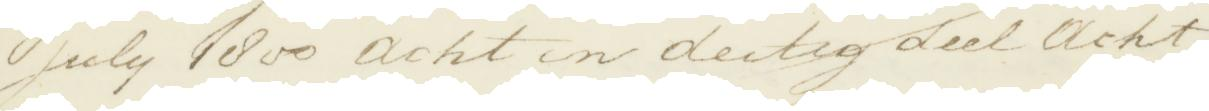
july 1800 acht in dertig deel acht
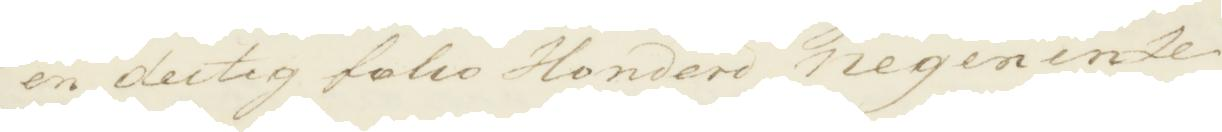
en dertig folio Honderd Negen en ze
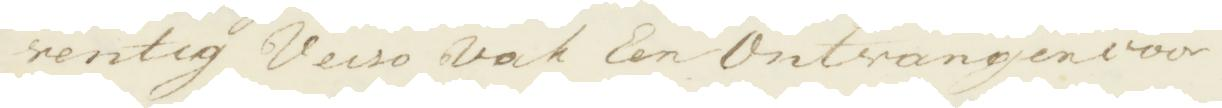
ventig Verso vak Een ontvangen voor
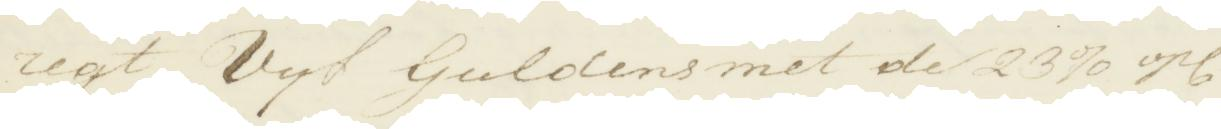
regt Vyf Guldens met de 23% opC
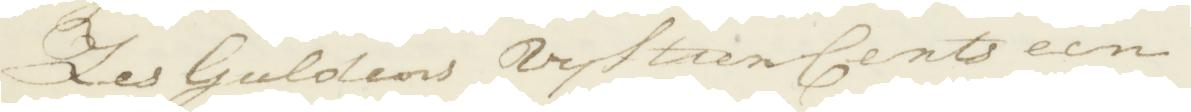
Zes Guldens vyftien Cents een
